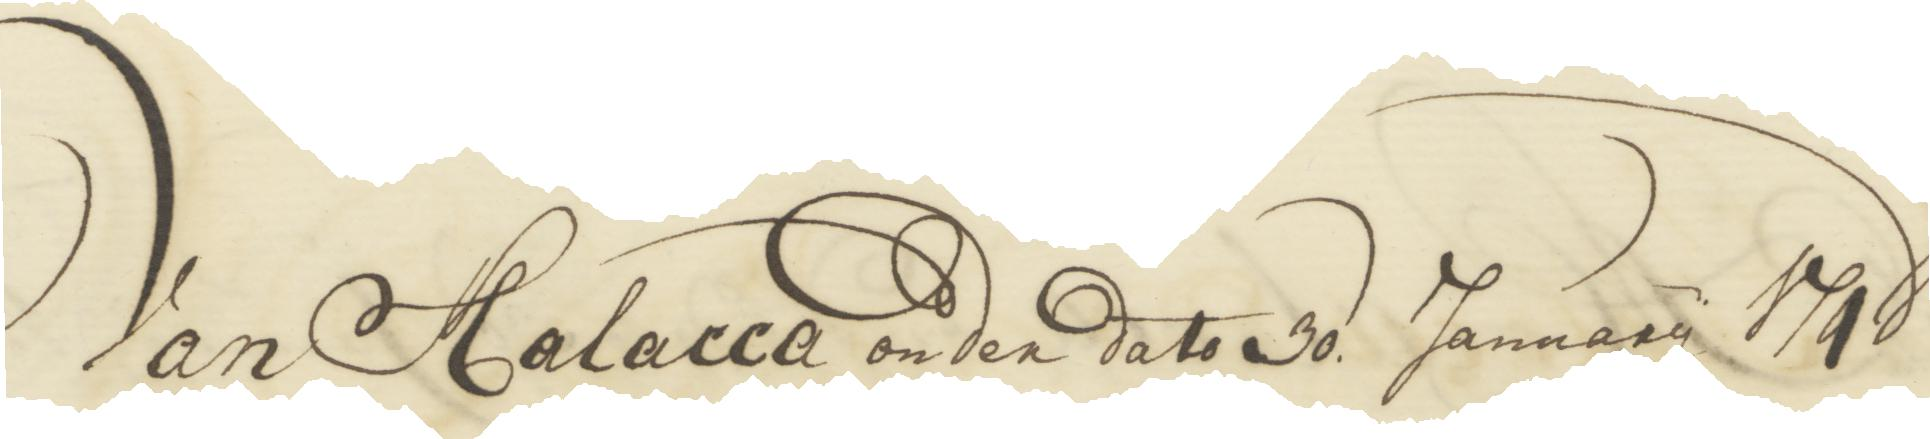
Van Malacca onder dato 30.' Januarij 1748
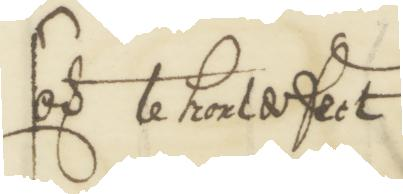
over te kort defect
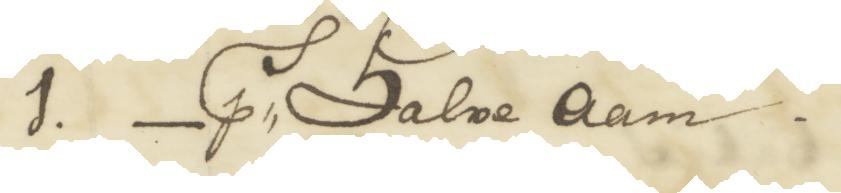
— 1. —p„s halve aam - - - - - - - - -
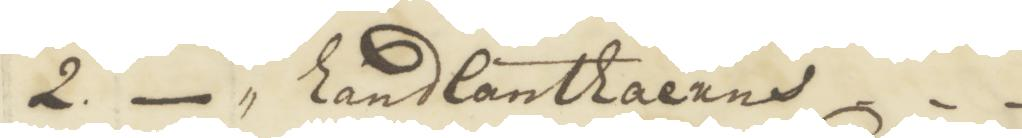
— 2. — „ handlanthaerns - - - - - - -
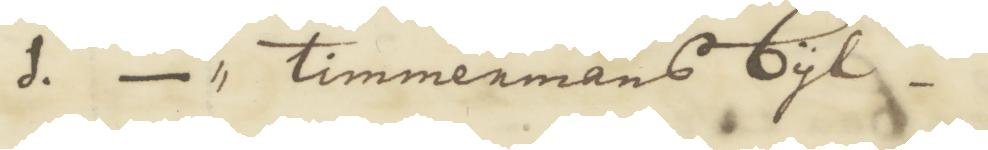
— 1. — „ timmermans bijl - - - - - -
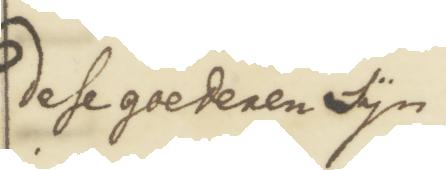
dese goederen sijn
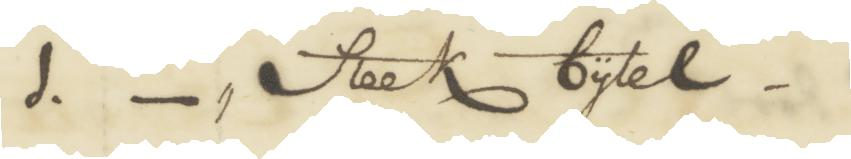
— 1. — „ steek bijtel - - - - - - - -
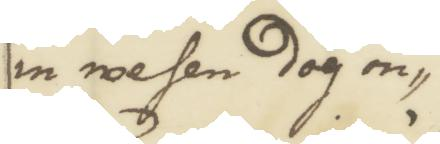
en wesen dog on„
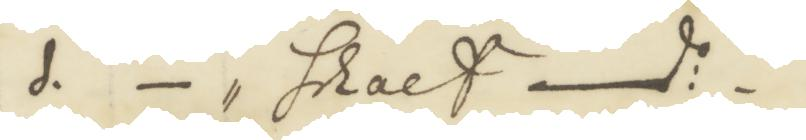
— 1. – „ schaef _:o - - - - - - - -
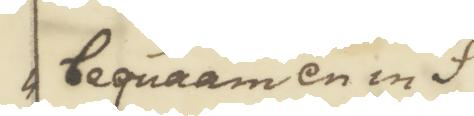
„ bequaam en in 's - - - - - - - -
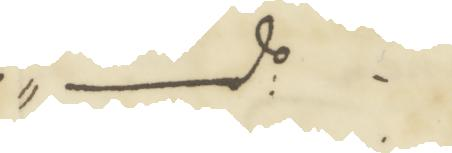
— 1. — „ _:o - - - - - - - - -
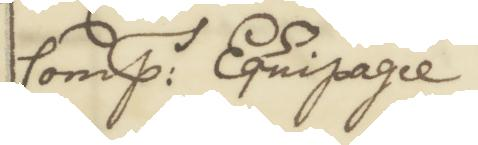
Comp:s Equipagie
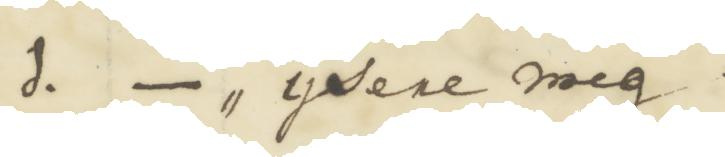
— 1. — „ ijsere weg - - - - - - - -
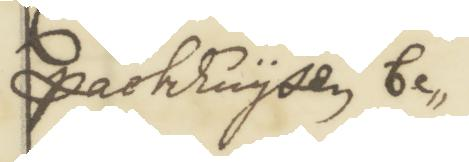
packhuijsen be„
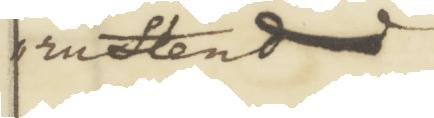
rustende
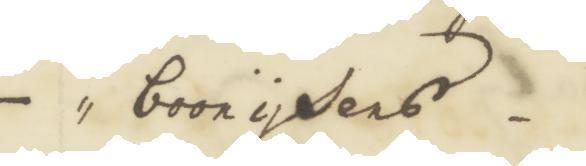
— 7. — „ boorijsers - - - - - - - - - -
